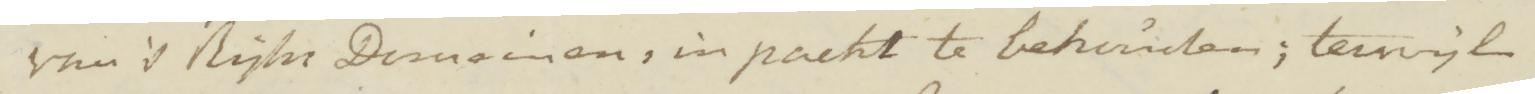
van 's Rijks Domeinen, in pacht te behouden; terwijl
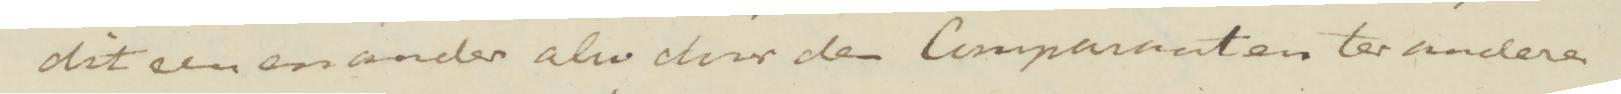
dit een en ander also door den Comparanten ter andere
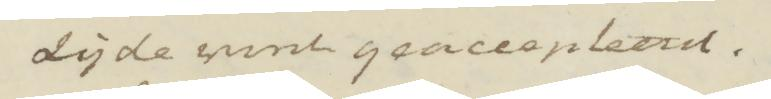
Zijde word geaccepteerd.
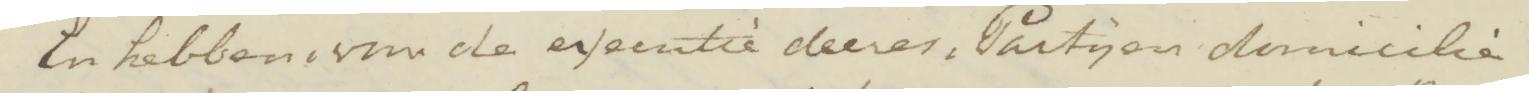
En hebben, voor de executie deezes, Partijen domicilie
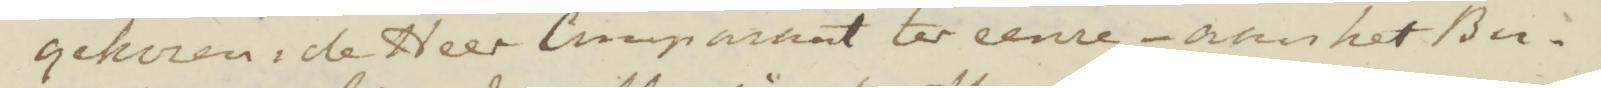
gekozen: de Heer Comparant ter eenre - aan het Bu=
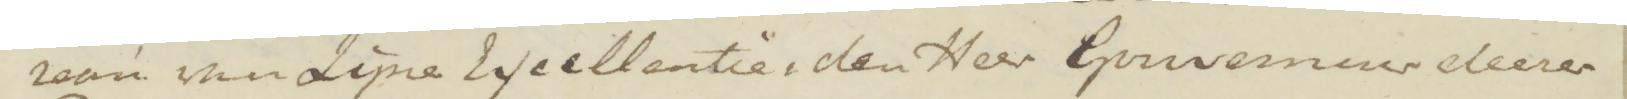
reau van Zijne Excellentie, den Heer Gouveneur deezer
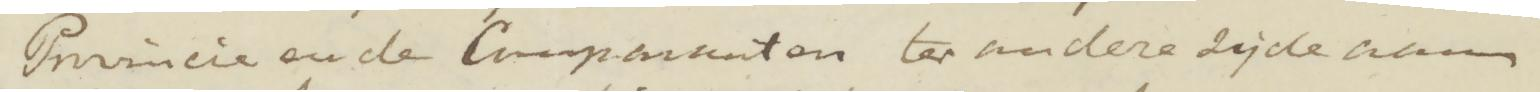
Provincie en de Comparanten ter andere zijde aan
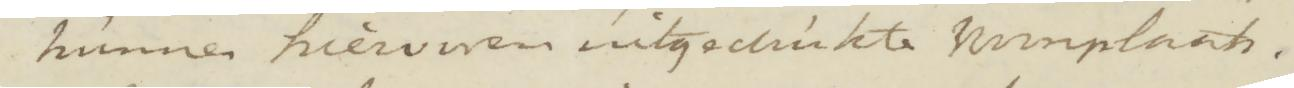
hunnen hiervoren uitgedrukte woonplaats,
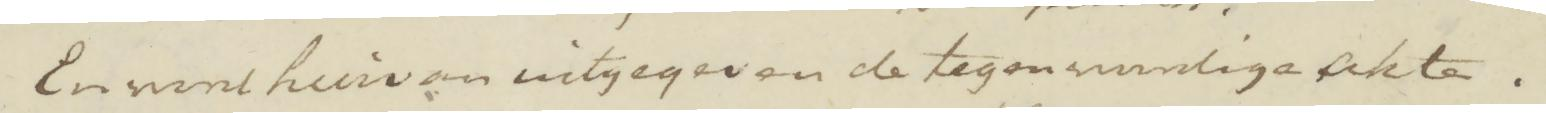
En word hiervan uitgegeven de tegenwoordige Akte.
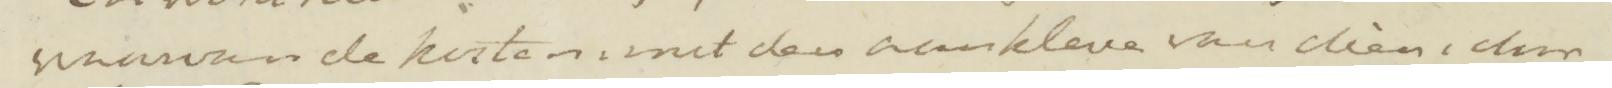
waarvan de kosten met den aankleve van dien, door
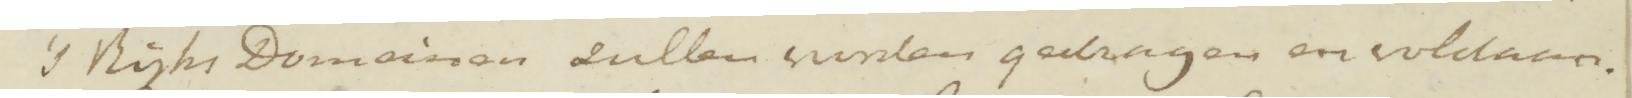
's Rijks Domeinen zullen worden gedragen en voldaan.
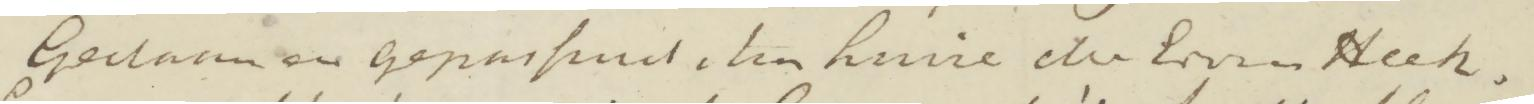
Gedaan en gepasseerd, ten huize de Erven Heek.
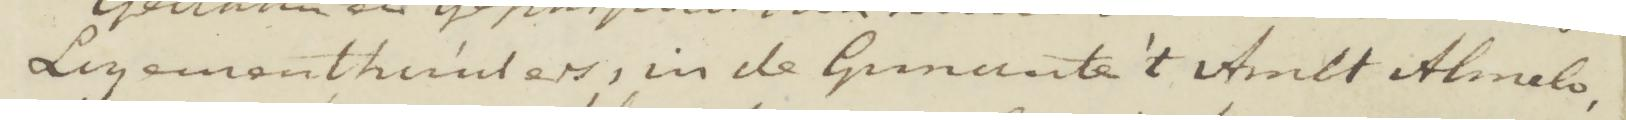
Logementhouders, in de Gemeente ’t Ambt Almelo,
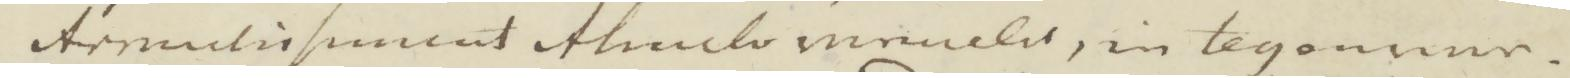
Arrondissement Almelo voormeld, in tegenwoor-
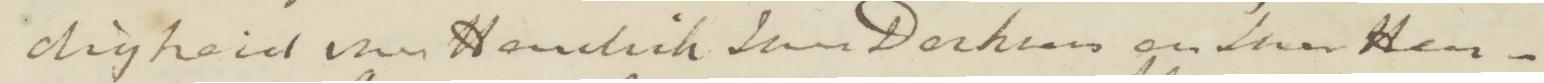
digheid van Hendrik Jan Derksen en Jan Hen-
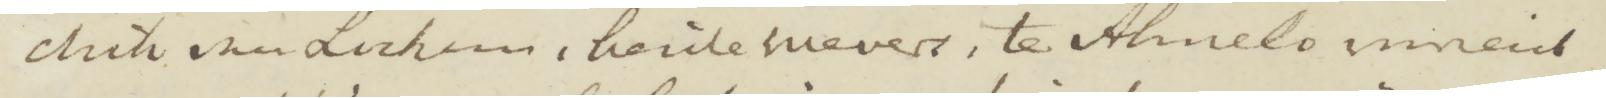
drik van Lochem, beide wevers, te Almelo voorzeid
